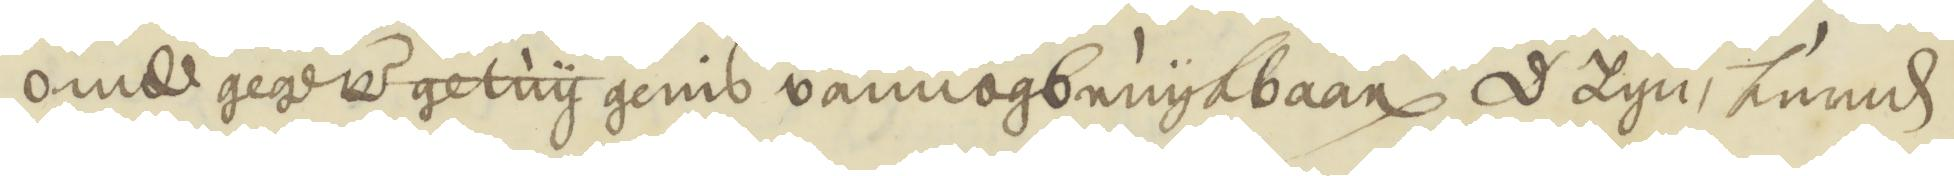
omde gegeve getuijgenis van nog bruijkbaar te Zyn, kunnen
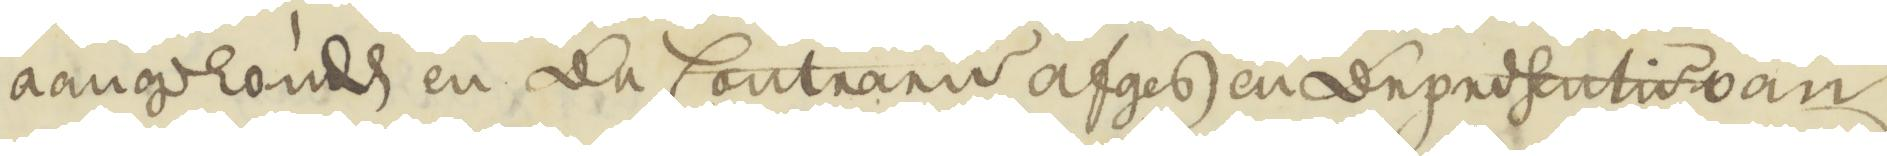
aangehouden en ter Contrarie afges en ter presentie van
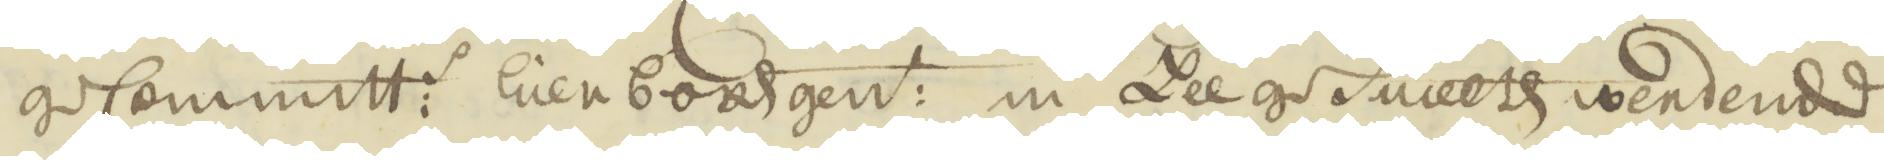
gecommitt:s hier boven gen:t in Zee gesmeeten werdende
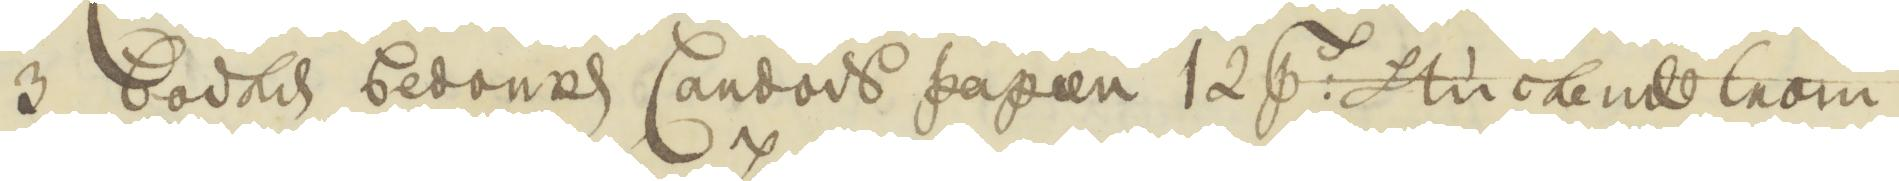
3 boeken bedorven Cardoes papier 12 p:s stuck ende trom
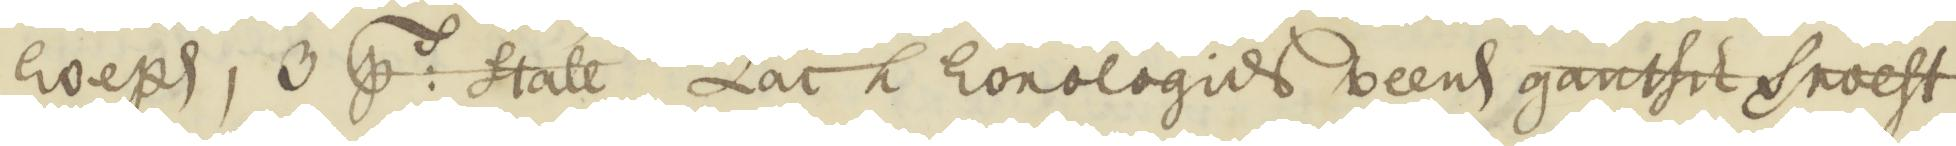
hoepen, 3 p:s stale Zack horologies veeren gantsch verroest
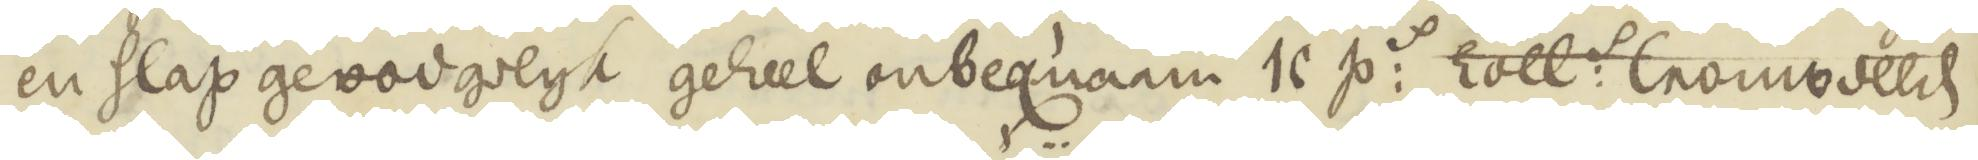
en slap gevoegelyk geheel onbequaam 15 p:s holl:s tromvellen
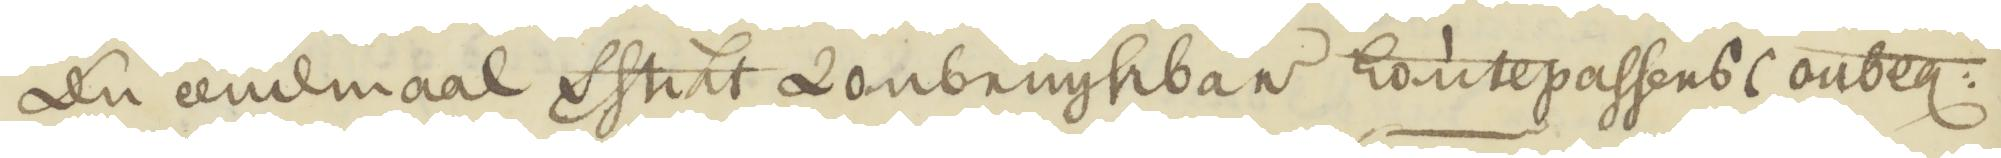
ten eenemaal verstikt 2 onbruijkbare houtepassers 5 onbeq:
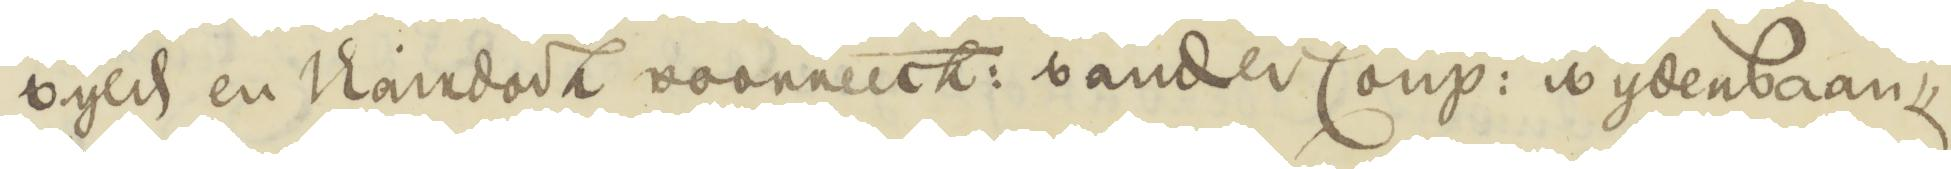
vylen en 1 hairdoek voorreeck: vander Comp: wijderbaan,
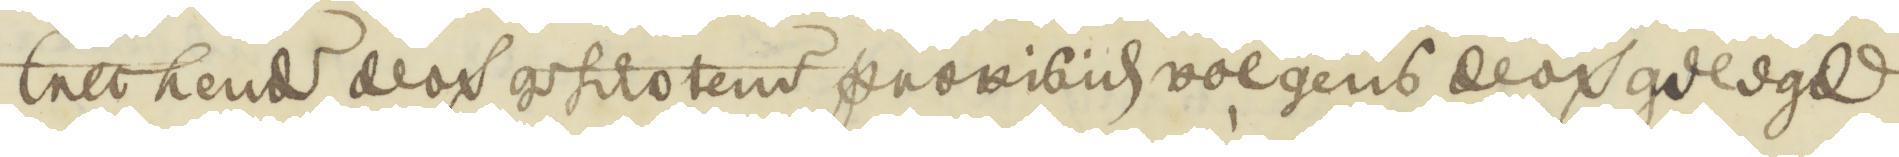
treckende de over geschotene provisien volgens de over gelegde
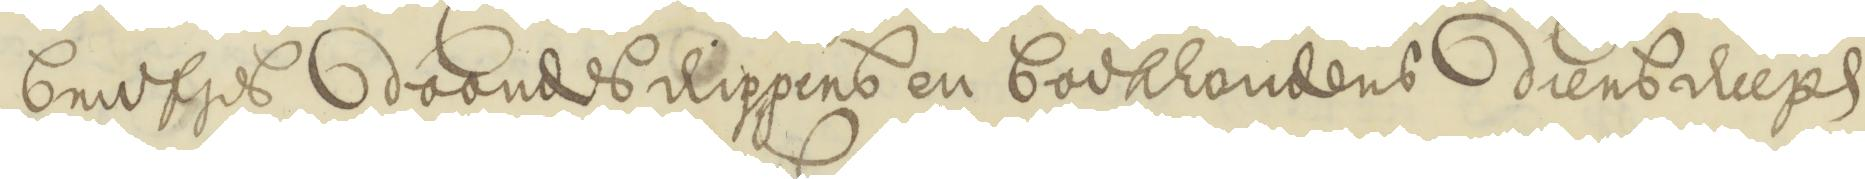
briefjes doorde schippers en boekhouders dier scheepen
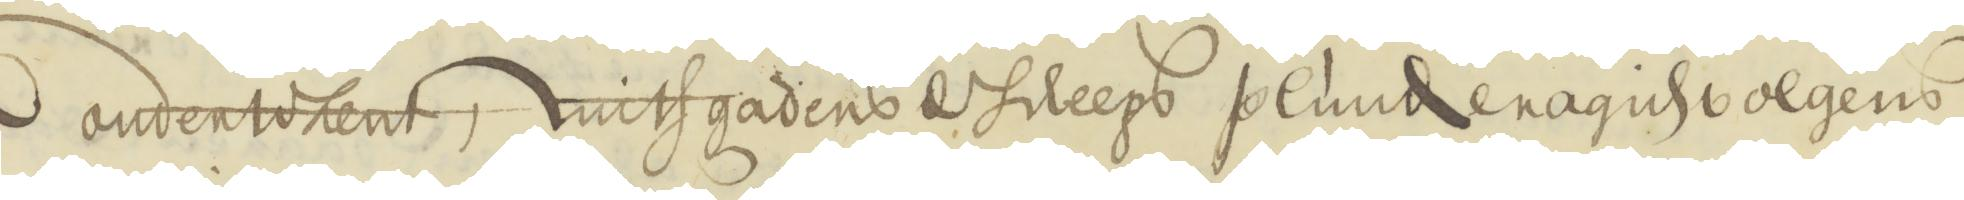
ondertekent, mitsgaders de scheeps plunderagien volgens
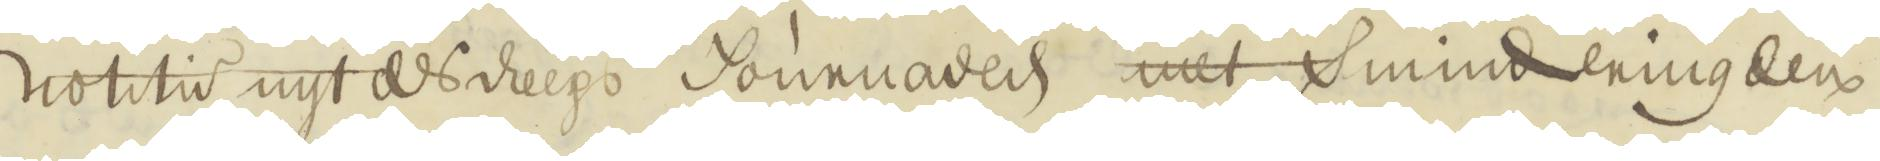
notitie uyt de scheeps Iournaelen met vermindering der
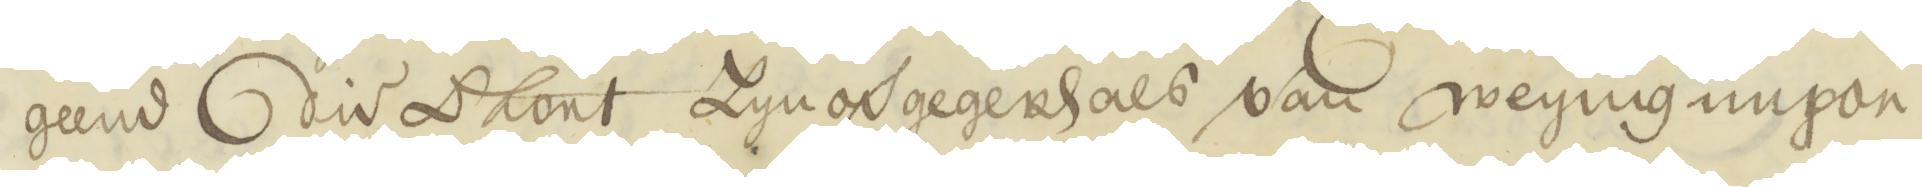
geene die tekort Zyn overgegeven als van weynig impor
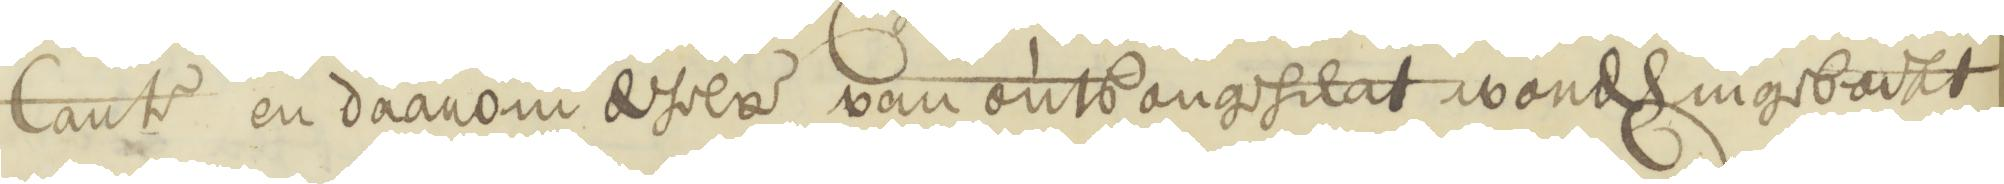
tante en daarom deselve van outs ongeschat worden ingeboekt
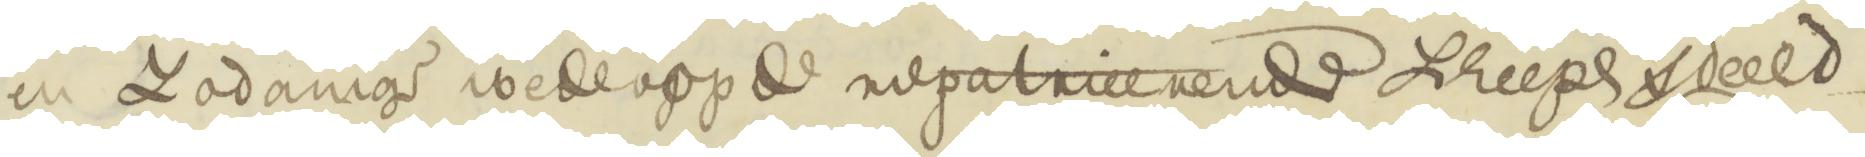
en Zodanige weder op de repatrieerende scheepen verdeeld
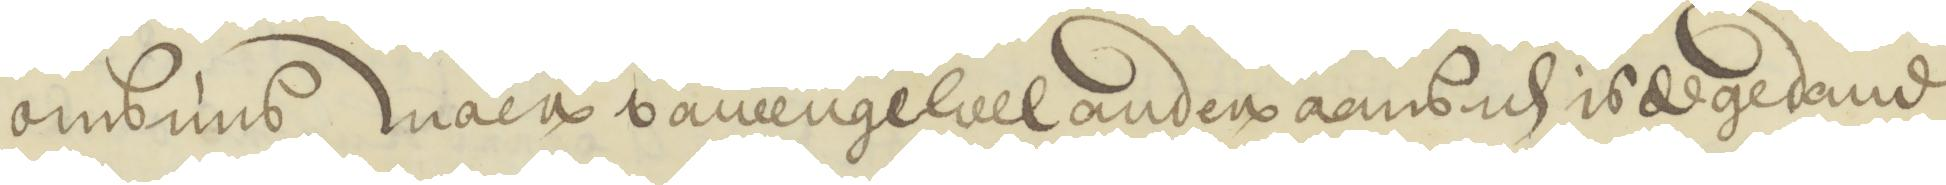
omsuns maer vaneen geheel ander aansien is de gedane
